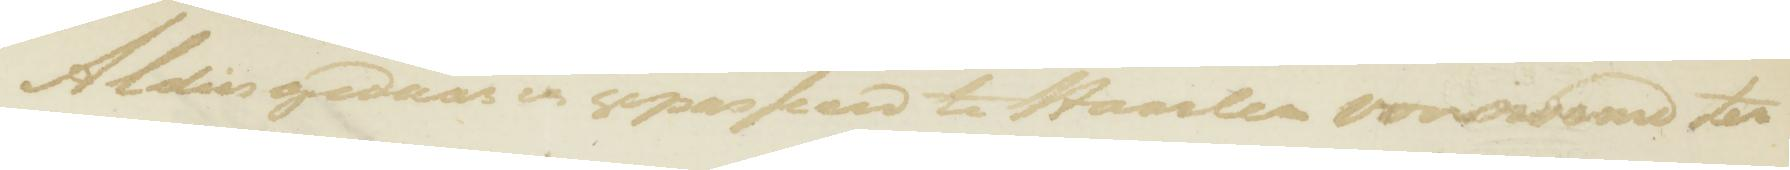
Aldus gedaan en gepasseerd te Haarlem voonoemd ter
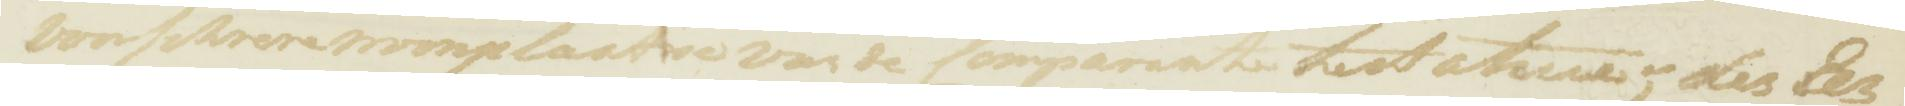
voorschreve woonplaatse van de Comparant testateur; den Een
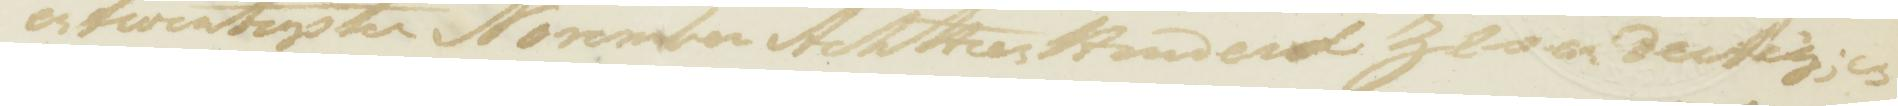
en twintigsten November Achttien Honderd Zes en dertig; en
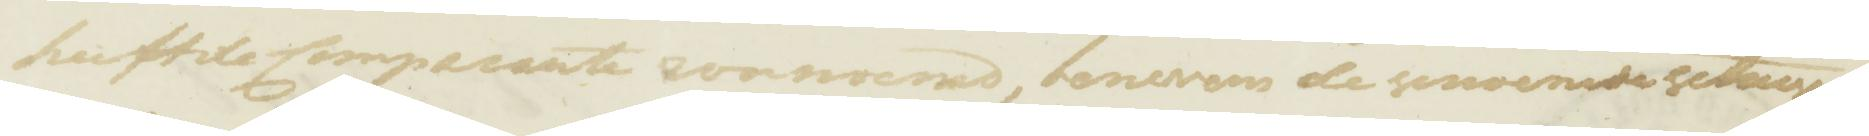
heeft de Comparante voornoemd, benevens de genoemde getuigen
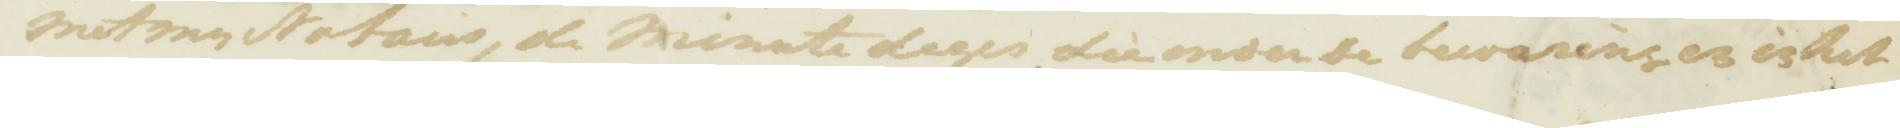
met my Notaris, de minute dezes, die onder de bewaring en in het
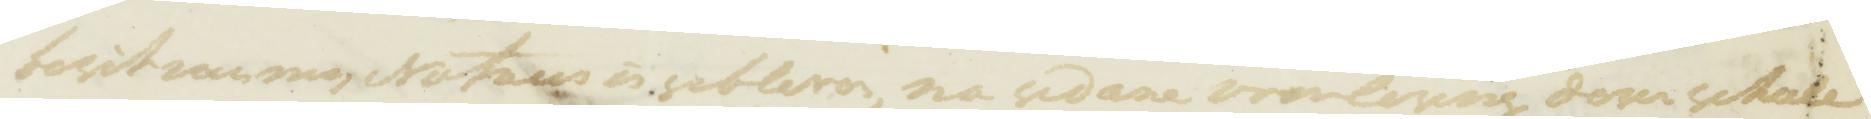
bezit van my Notaris is gebleven, na gedane voorlezing dezer geheele
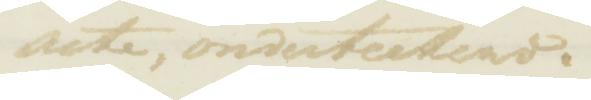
acte, onderteekend.
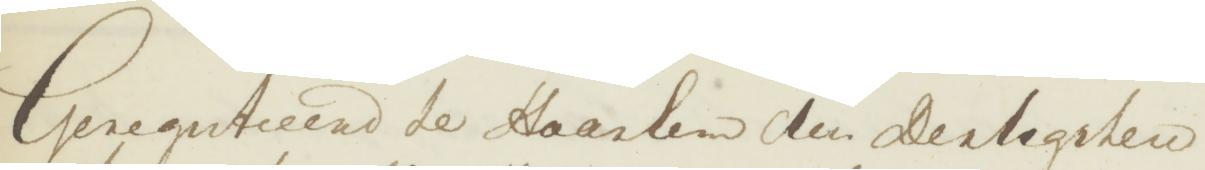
Geregistreerd te Haarlem den dertigsten
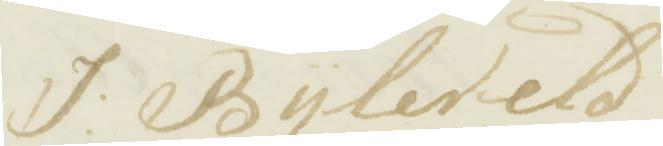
J: Bijleveld
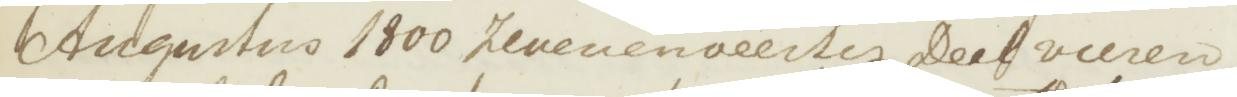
Augustus 1800 Zevenenveertig Deel vieren
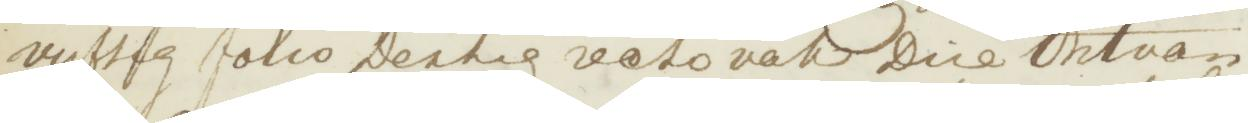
vyftig folio Dertig recto vak Drie Ontvan
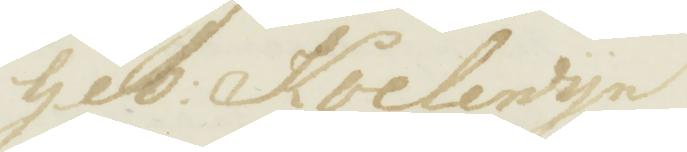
Geb: Koelewijn
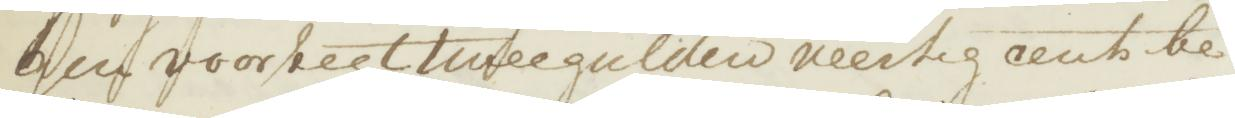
gen voor Regt twee gulden veertig cents be
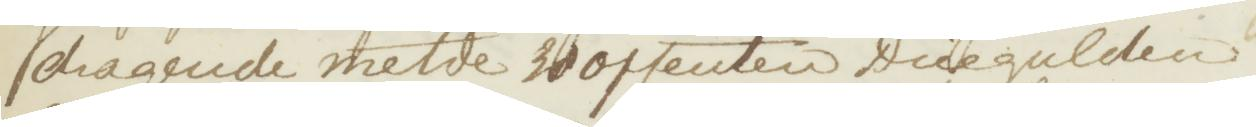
dragende met de 30 opcenten Drie gulden
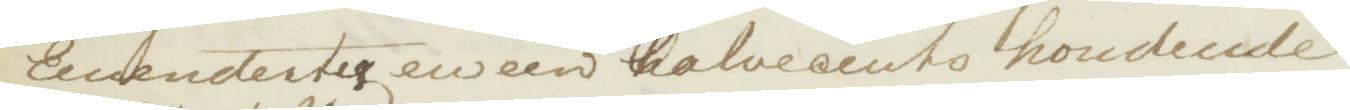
Eenendertig en een halve cents houdende
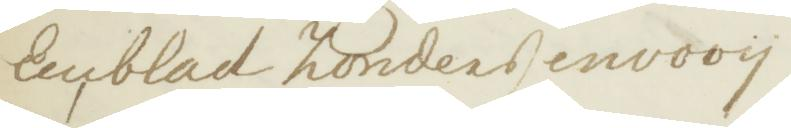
Een blad Zonder Renvooij
